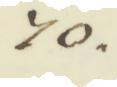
70„
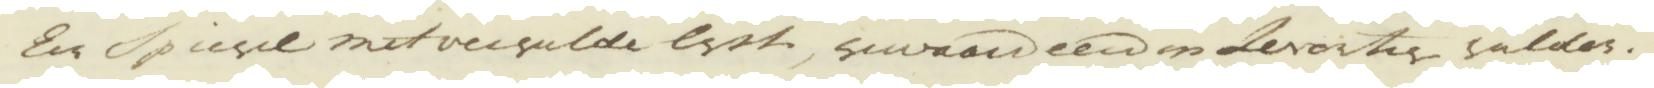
Een Spiegel met vergulde lyst, gewaardeed op Zeventig gulden.
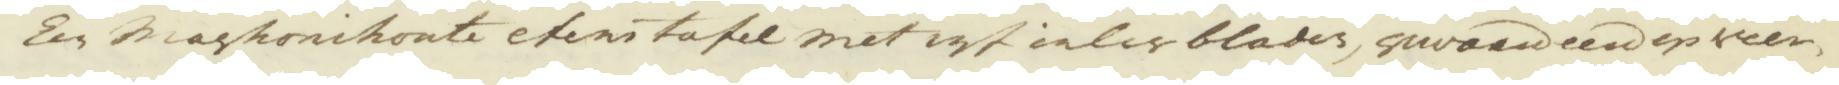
Een maghonihoute etens tafel met vyf inleg bladen, gewaardeerd op veer,
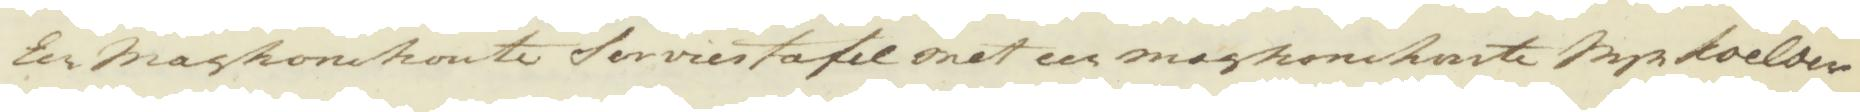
Een maghonihoute Serviestafel met een moghonihoute wyn koelder
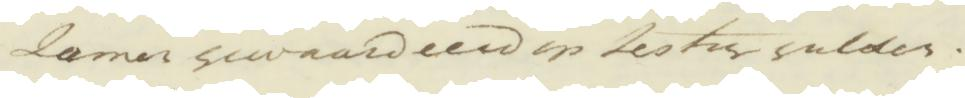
zamen gewaardeerd op zestig gulden
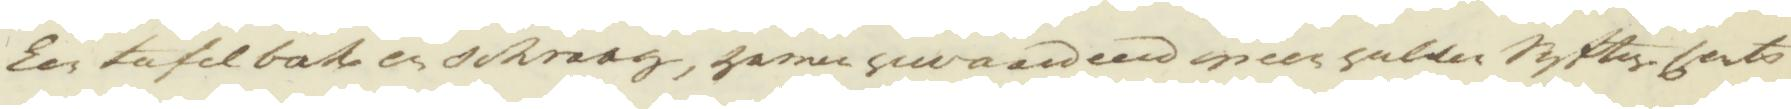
Een tafelbak en schraag, zamen gewaardeerd op een gulden Vyftig Cents
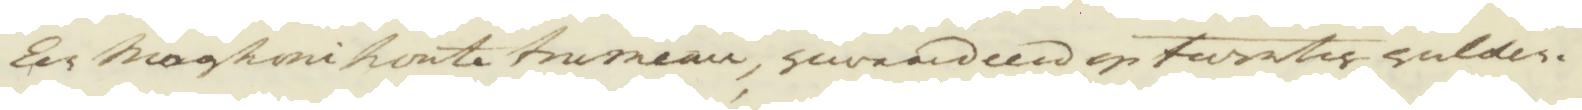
Een maghonihoute trumeau, gewaardeerd op twintig gulden.
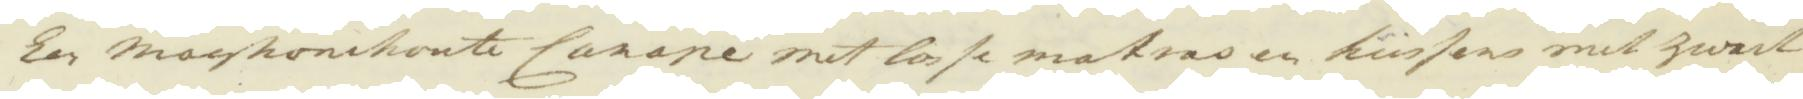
Een maghonihoute Canapé met losse matras en kussens met zwart
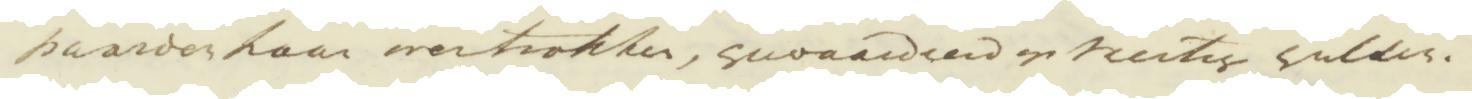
paarden haar overtokken, geewaardeerd op Veertig Gulden.
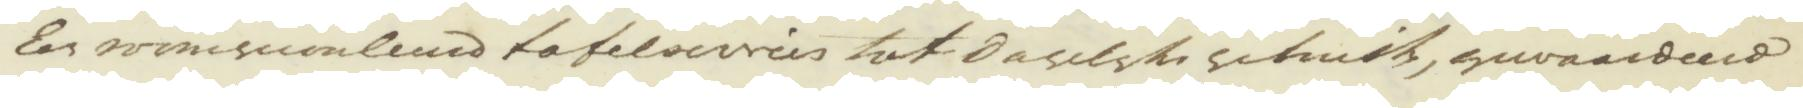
Een vooregecouleurd tafelservies tot dagelyks gebruik, gewaardeerd
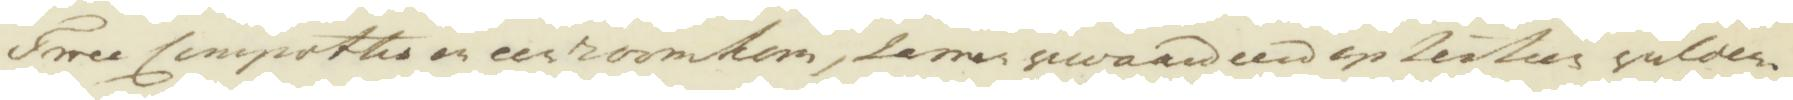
Twee Compottes en een roomkom, tezamen gewaardeerd op zestien gulden.
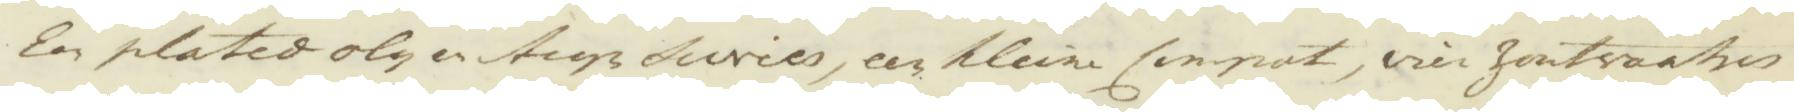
Een plated oly en Azyn servies, een kleine Compot, vier zoutvaatjes
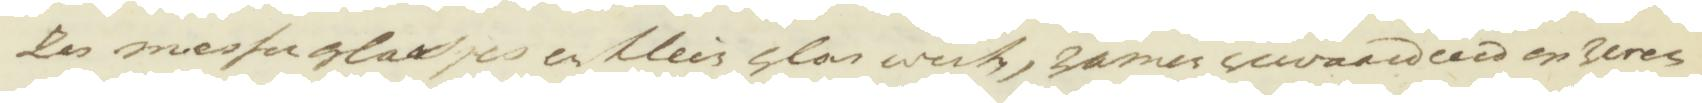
zes mosterglaasjes en klein glas werk, zamen gewaardeerd op zeven
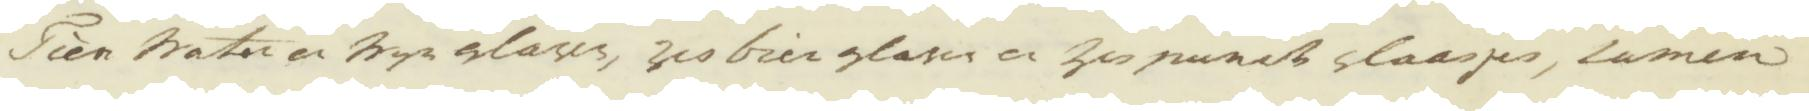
Tien water en wyn glazen, zes bier glazen en zes punch glaasjes, zamen
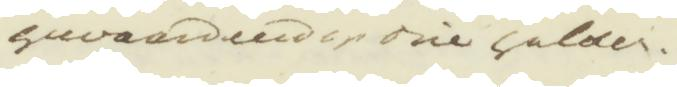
gewaardeerd op drie Gulden.
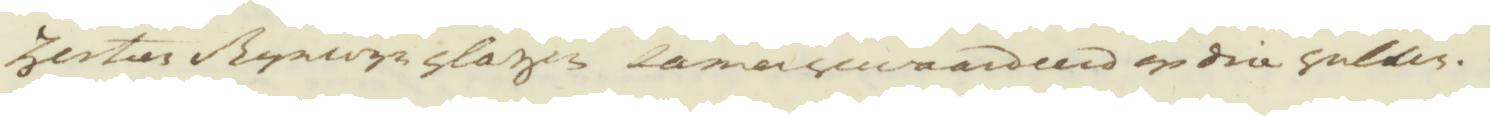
Zestien Rynwyn glazen zamen gewaardeerd op drie gulden.
